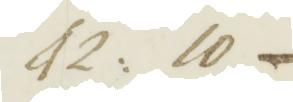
42: 10 —
